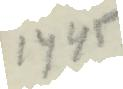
1745
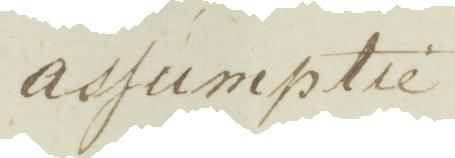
assumptie
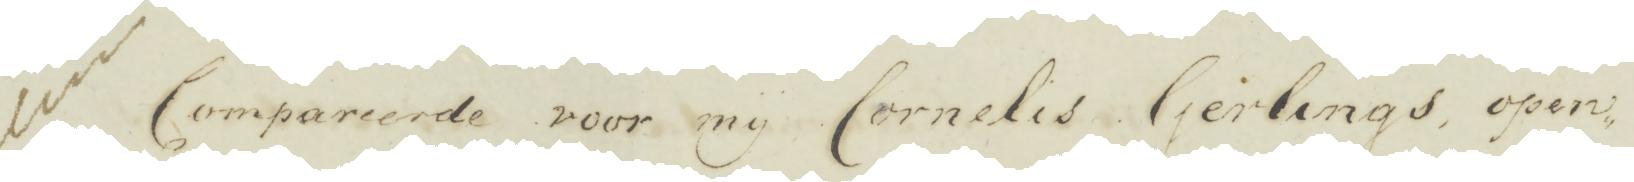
Compareerde voor mij Cornelis Gerlings, open„
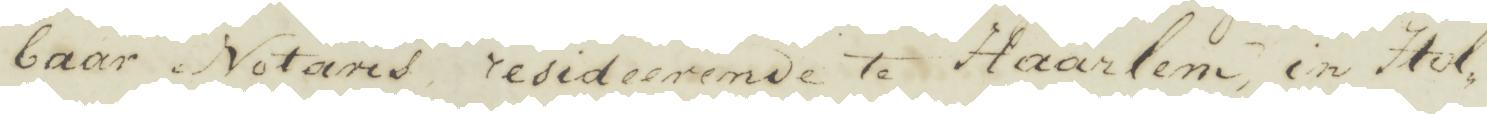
baar Notaris, resideerende te Haarlem, in Hol„
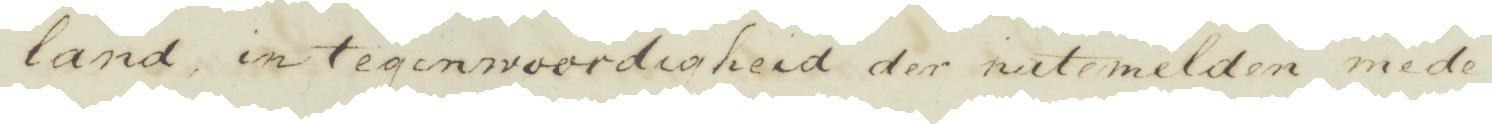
land, in tegenwoordigheid der natemelden mede
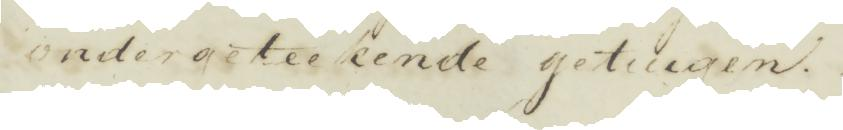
ondergeteekende getuigen.
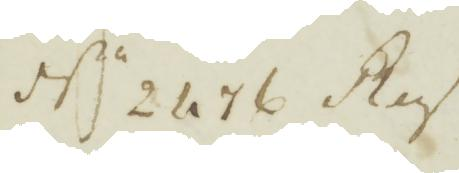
N„o 2476 Reg
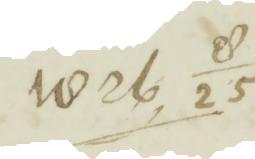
1826, 8/25
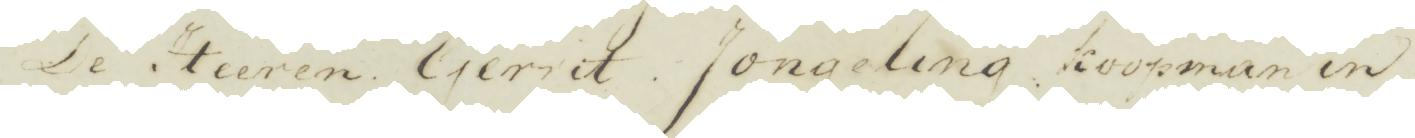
De Heeren Gerrit Jongeling koopman in
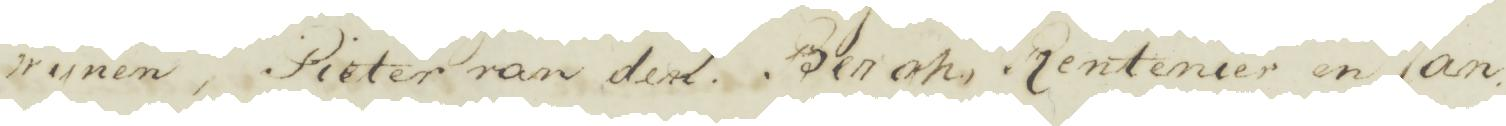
wijnen, Pieter van den Bergh Rentenier en Jan
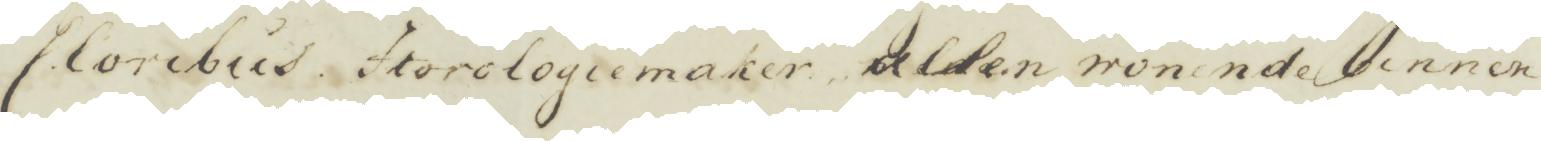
Cloribus. Horologeemaker allen wonende binnen
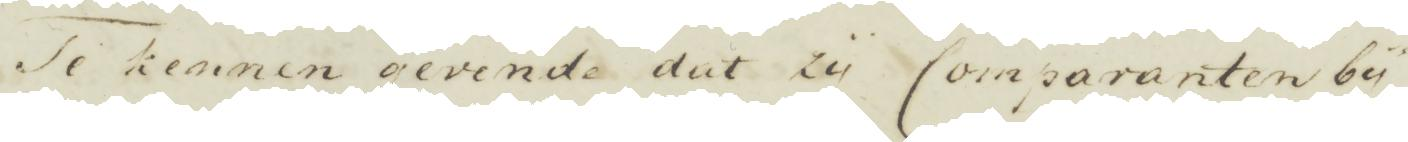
Te kennen gevende dat zij Comparanten bij
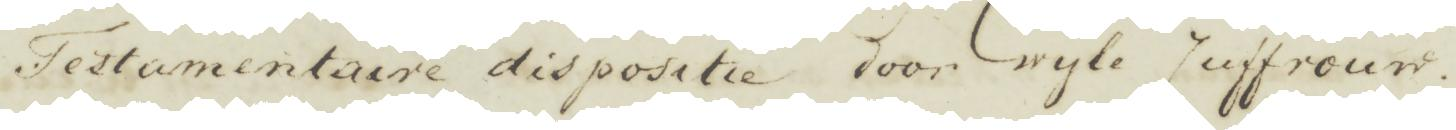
Testamentaire dispositie door wijle Juffrouw.
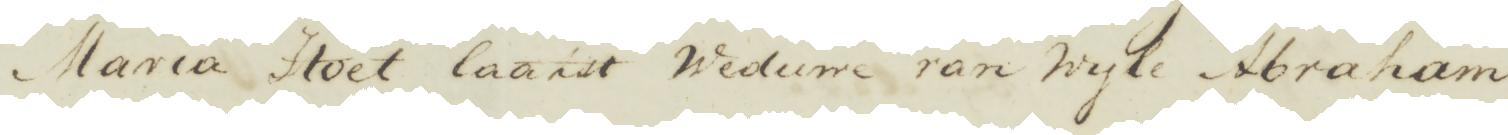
Maria Hoet laatst Weduwe van Wijle Abraham
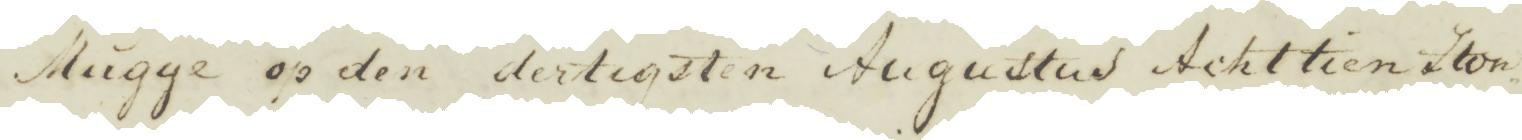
Mugge op den dertigsten Augustus Achttien Hon
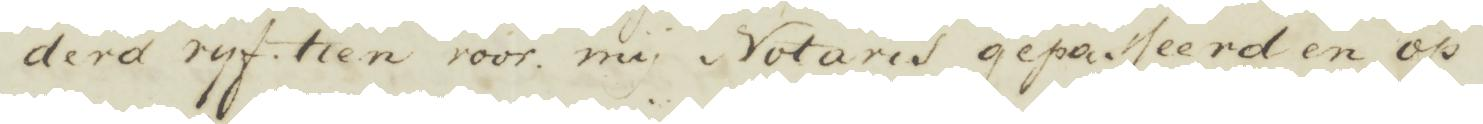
derd vijf tien voor mij Notaris gepasseerd en op
